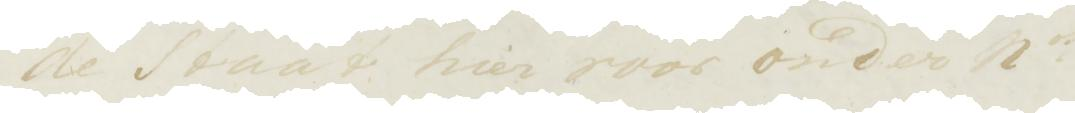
de staat hier voor onder no.s
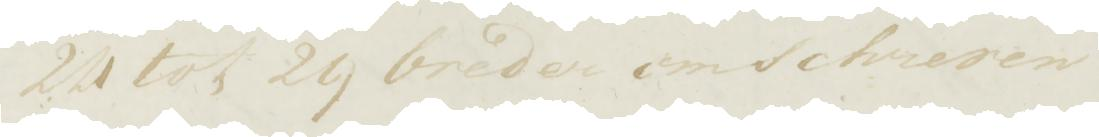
24 tot 29 breder omschreven
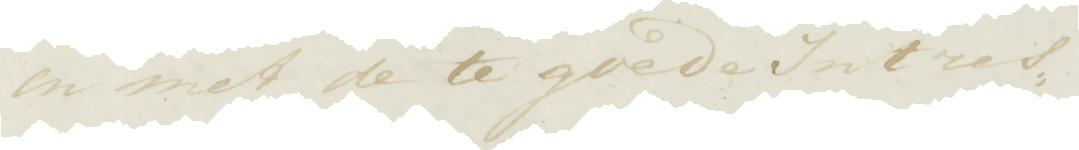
en met de te goede Intres„
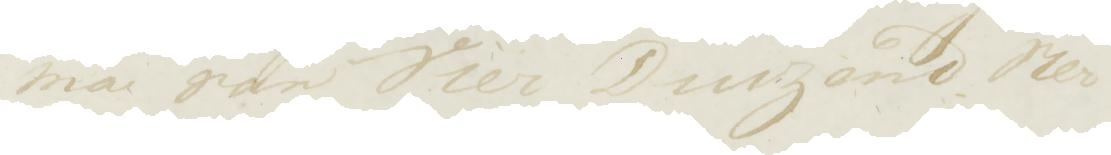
ma van Vier Duizend vier
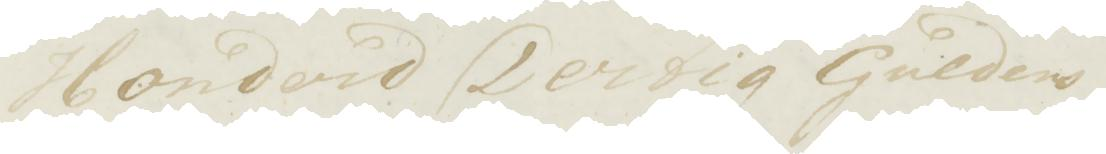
Honderd Dertig Guldens
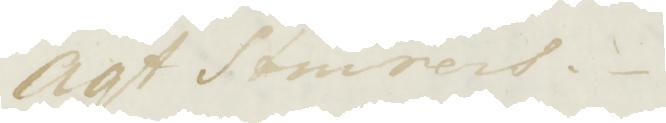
Agt stuivers.
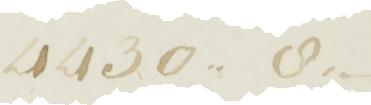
4430 „ 8 „
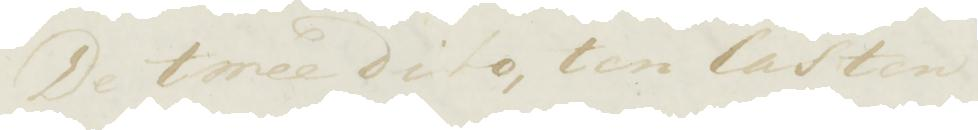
De twee dito, ten lasten
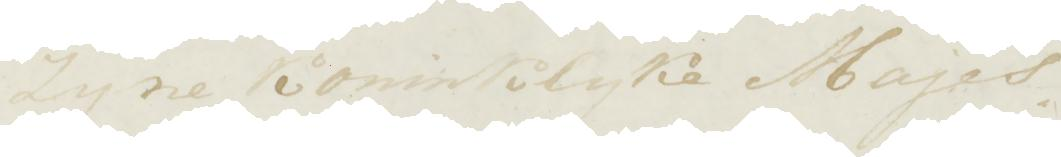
zyne Koninklyke Majes„
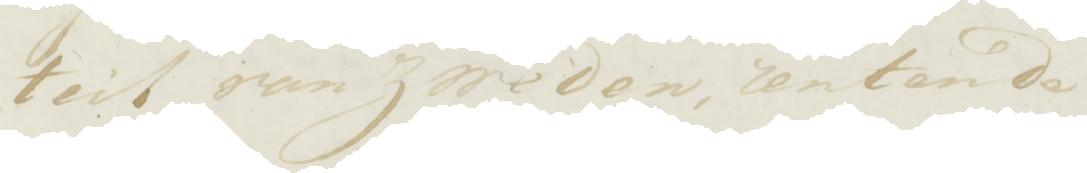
teit van Zweden, rentende
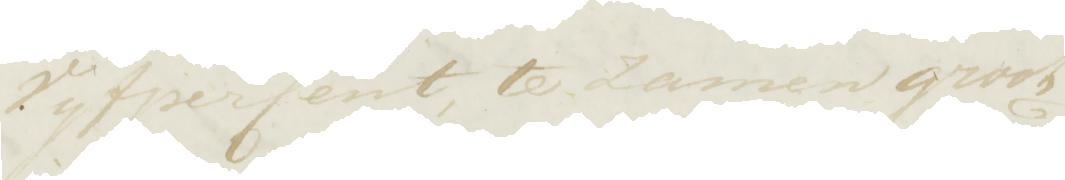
Vyfpercent, te zamen groot
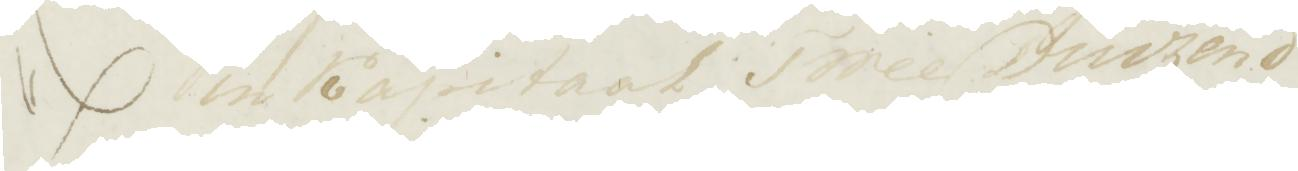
in Kapitaal Twee Duizend
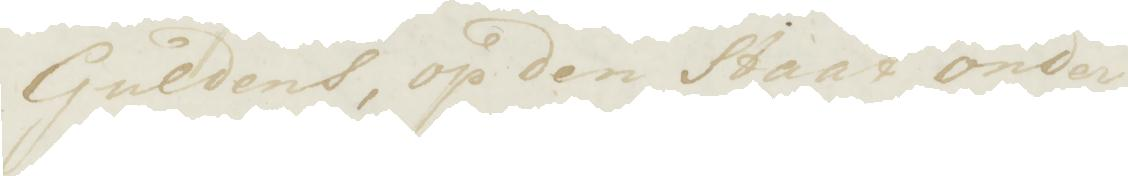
Guldens, op den staar onder
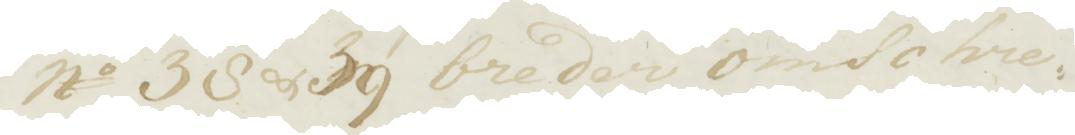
N=o 38 & 39 breder omschre„
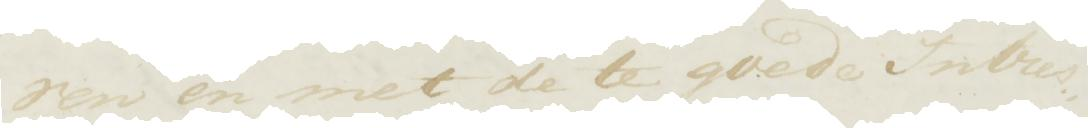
ven en met de te goede Intres„
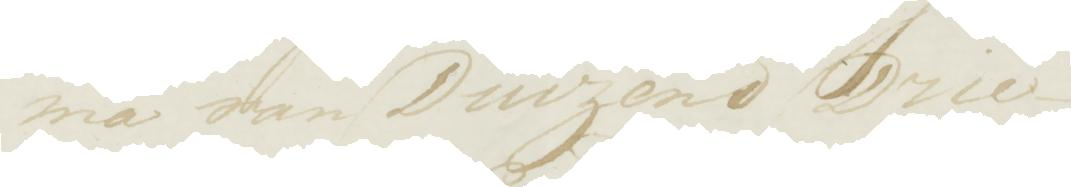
ma van Duizend Drie
